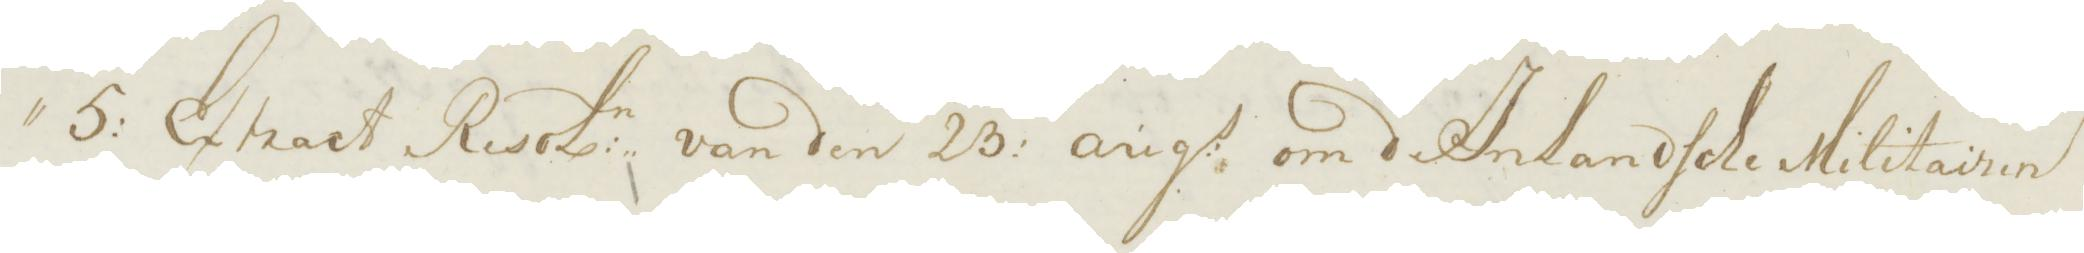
„ 5: Extract Resol:n„ van den 23: Aug:s om d Inlandsche Militairen
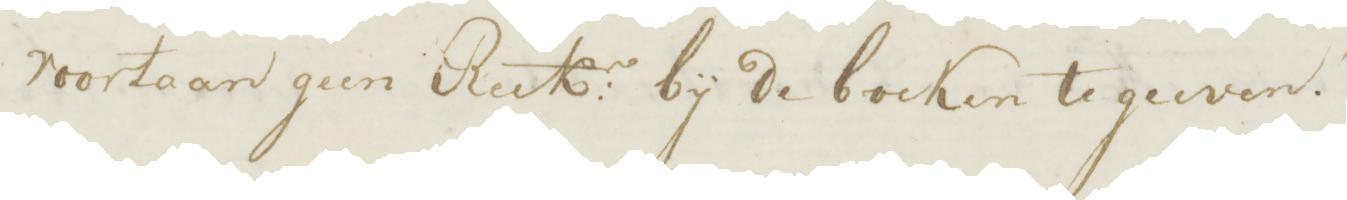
voortaan geen Reek:e bij de boeken te geeven.
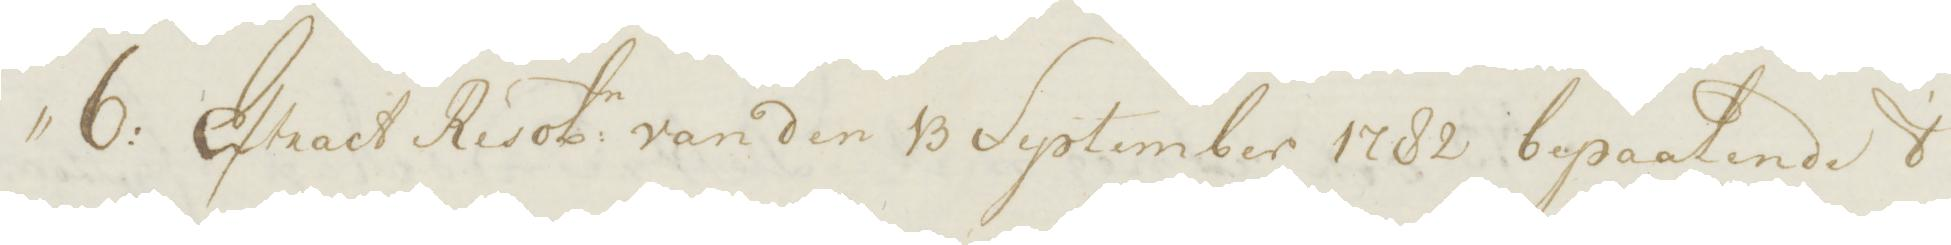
„ 6: Extract Resol:n van den 13 September 1782 bepaalende 't
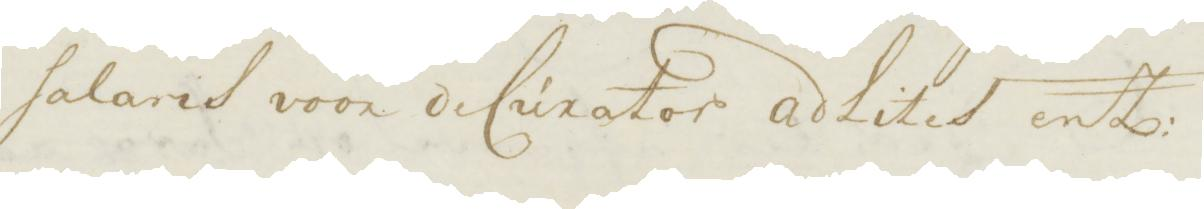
salaris voor de Curator ad lites enZ:
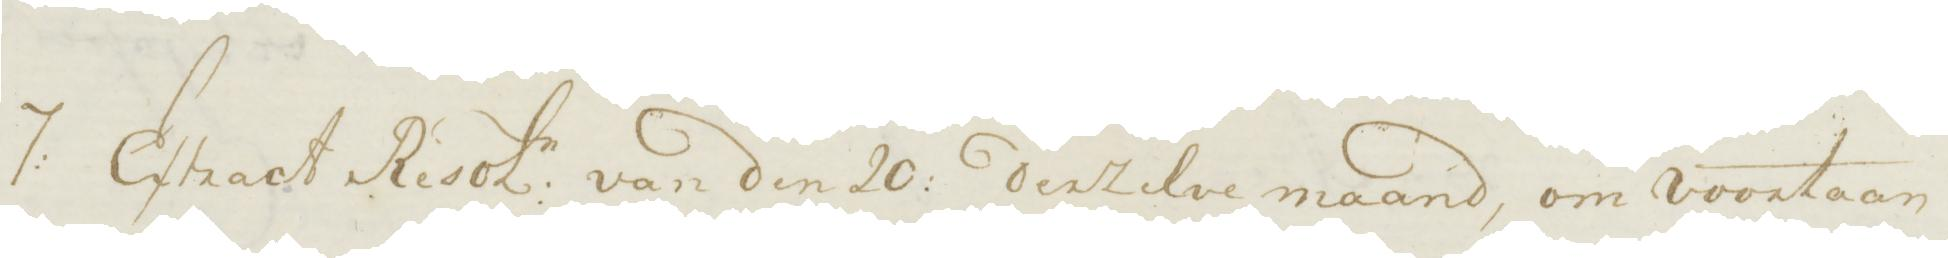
7: Extract Resol:n van den 20: derzelve maand, om voortaan
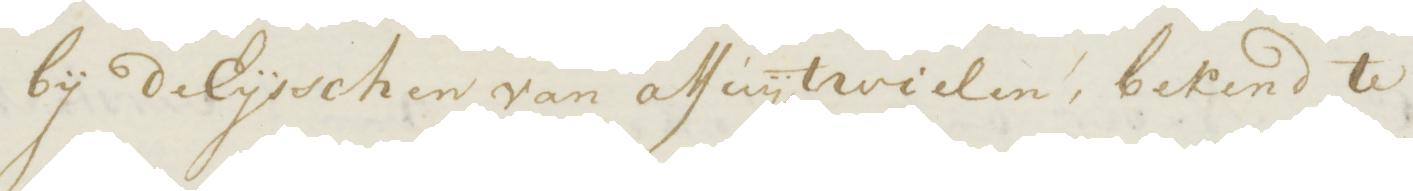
bij de Eijsschen van Muijtwielen, bekend te
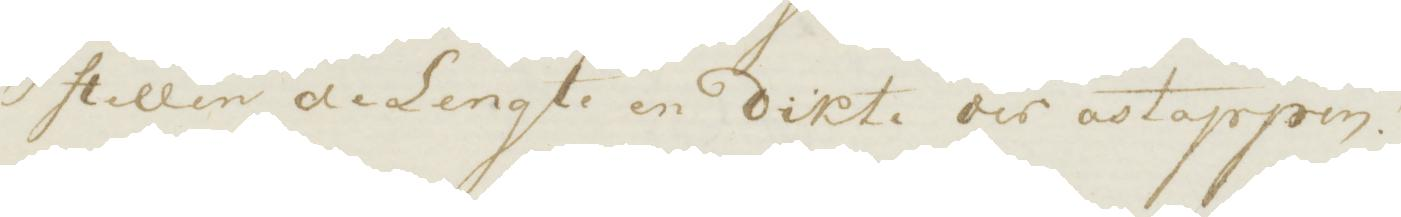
stellen de Lengte en dikte des astappen.
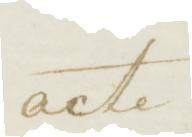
acte
